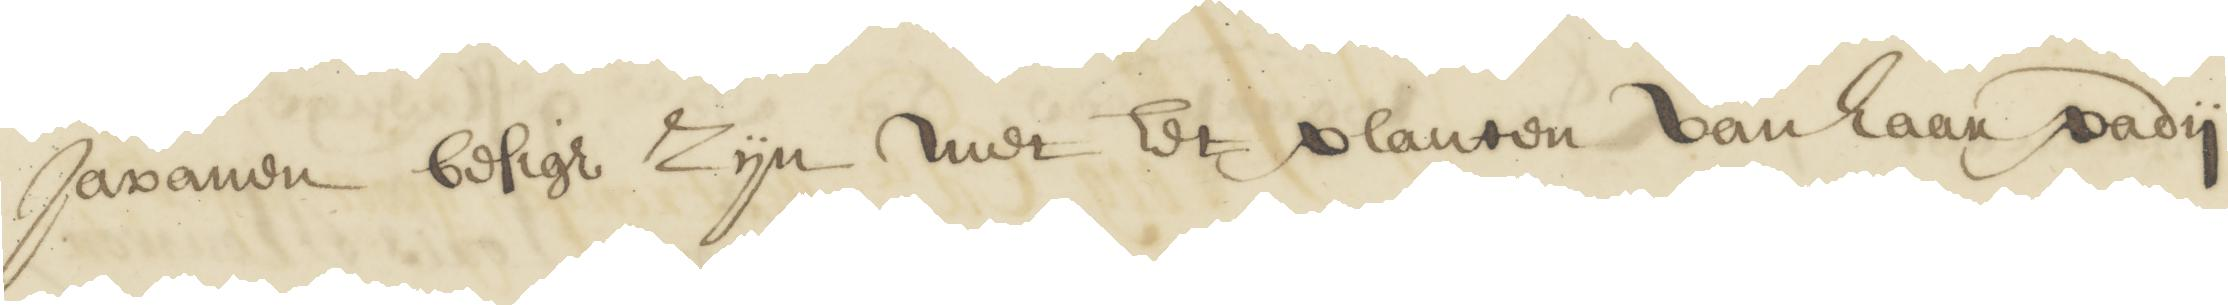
Javanen besigh zijn Met het planten Van haar padij
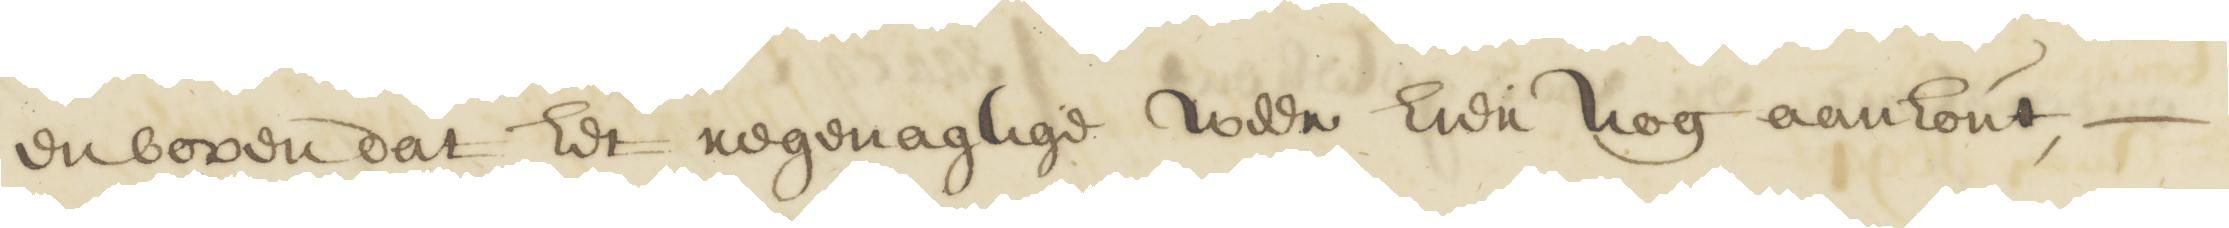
en boven dat het regenagtige Weer hier Nog aanhout, —
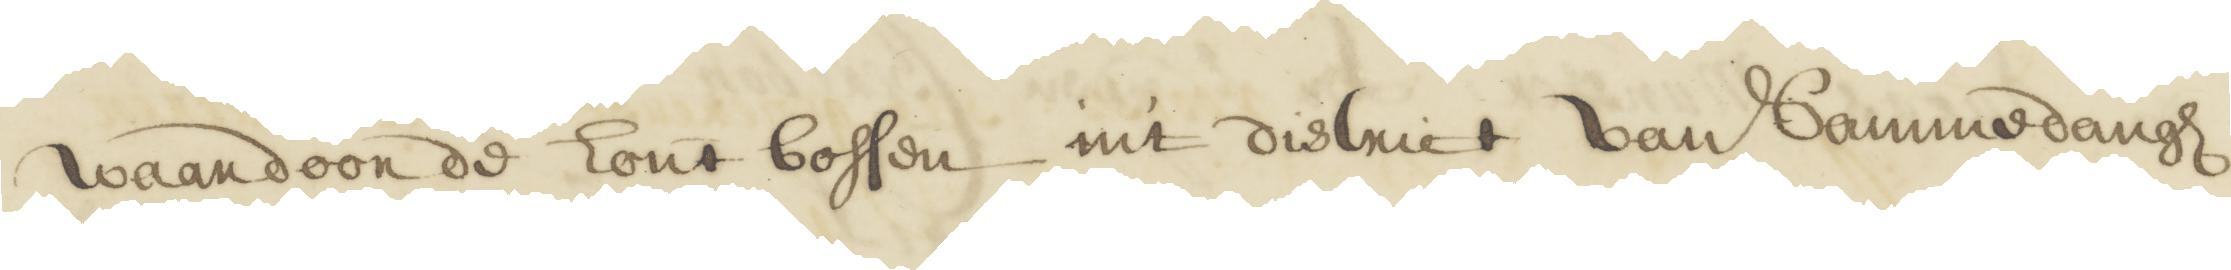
Waardoor de hout bossen in’t district Van sammedangh
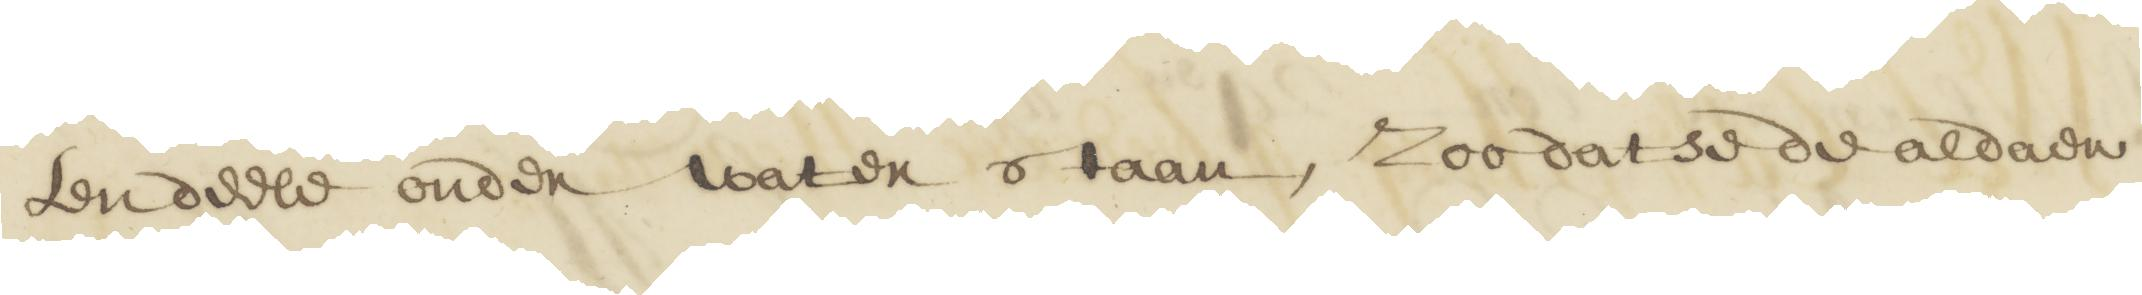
tendeele onder water staan, zoo datse de aldaer
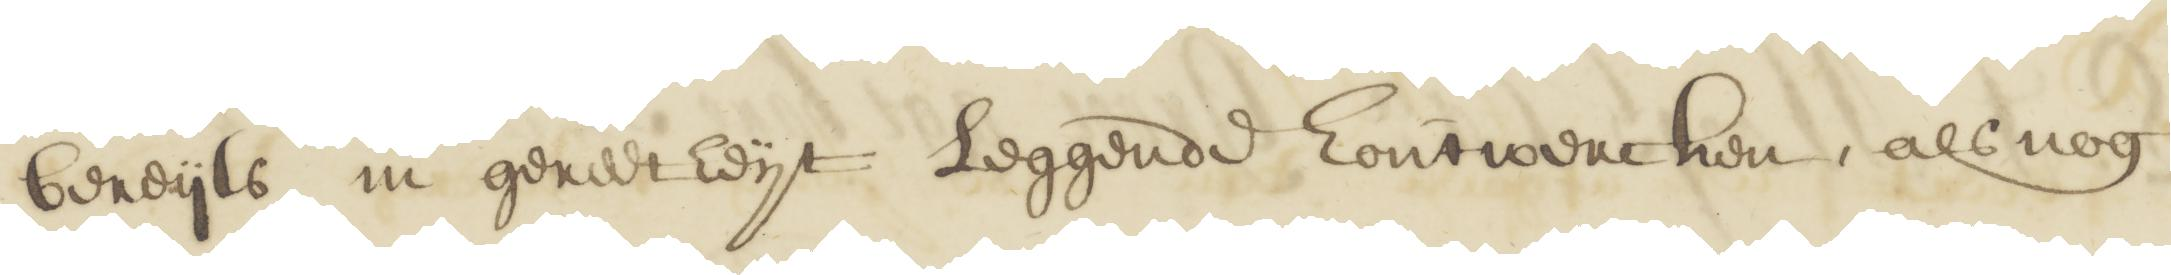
bereijts in gereetheijt leggende houtwercken, als nog
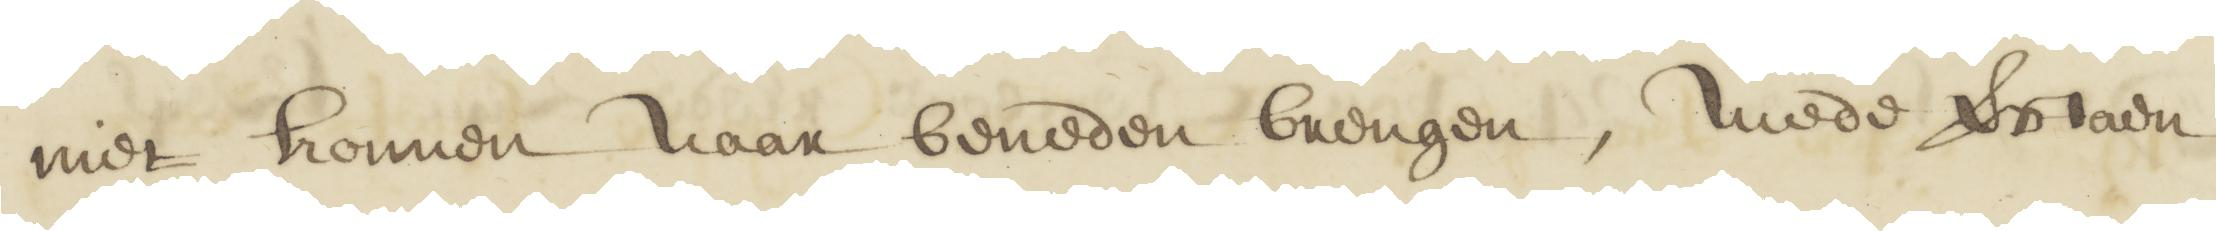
niet konnen Naar beneden brengen, Mede verstaen
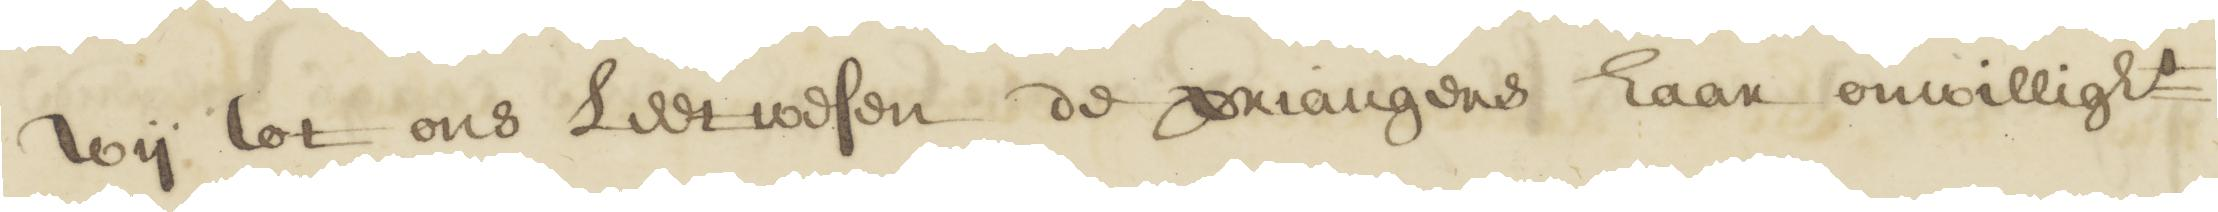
wij tot ons leetwesen de priangers haar onwilligh=t
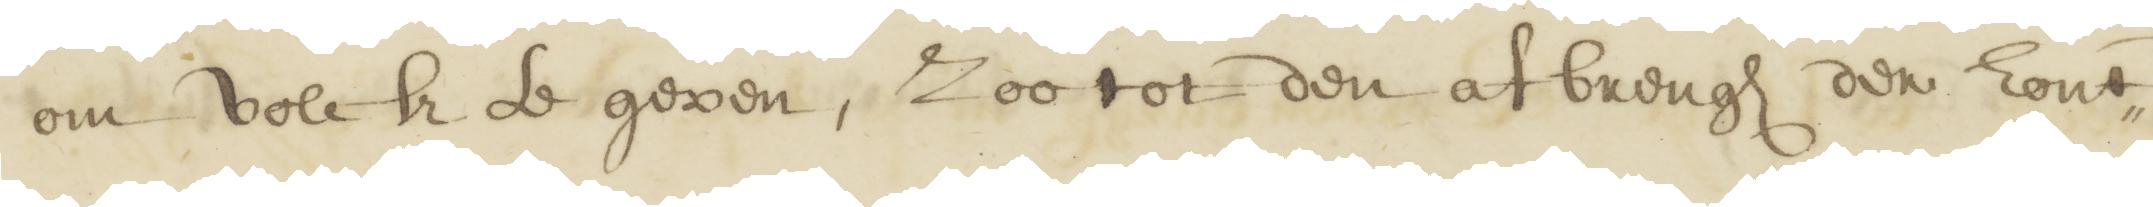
om Volck te geven, zoo tot den afbrengh der hout„
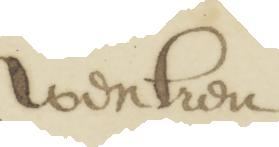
Werken
